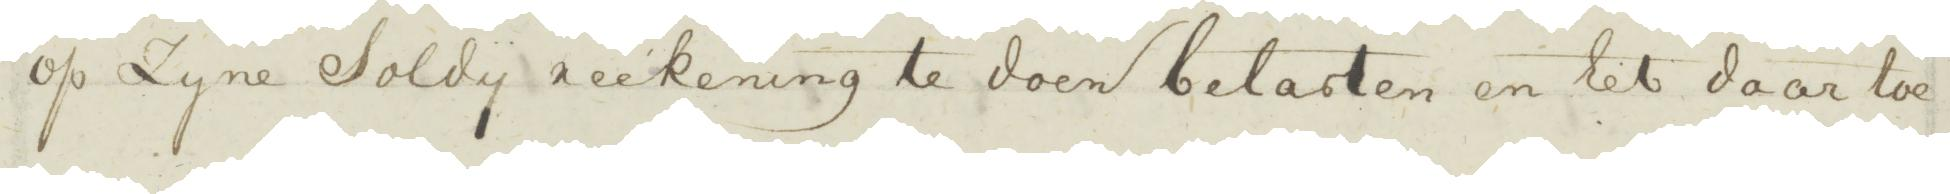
op zyne soldij reekening te doen belasten en het daar toe
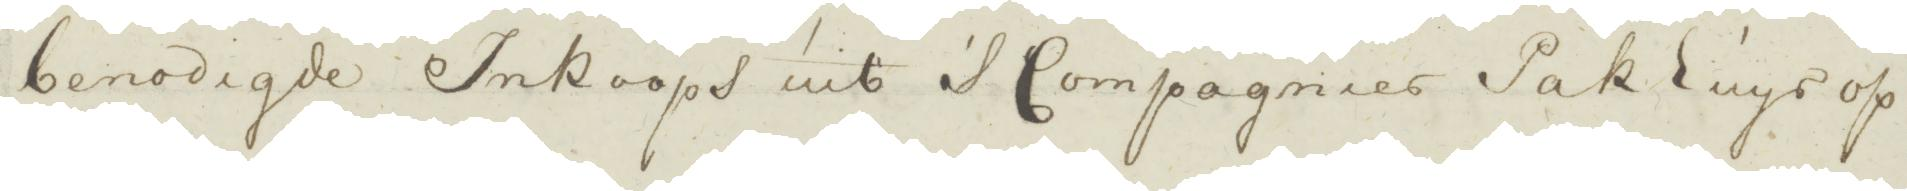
benodigde Inkoops uit ’s Compagnies Pak huijs op
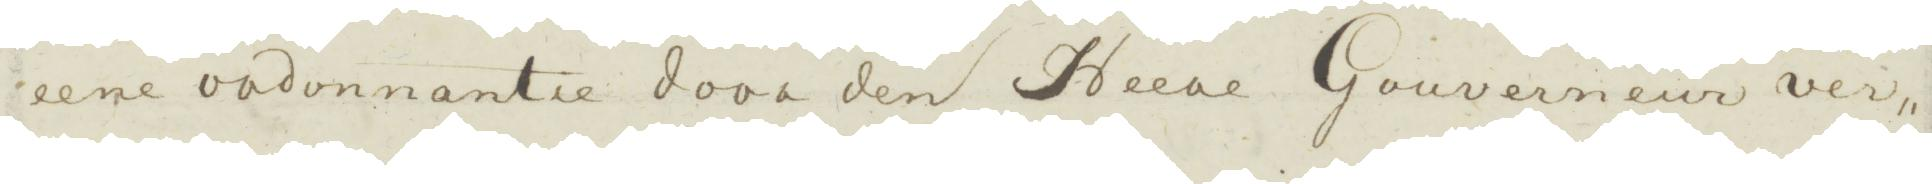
eene ordonnantie door den Heere Gouverneur ver„
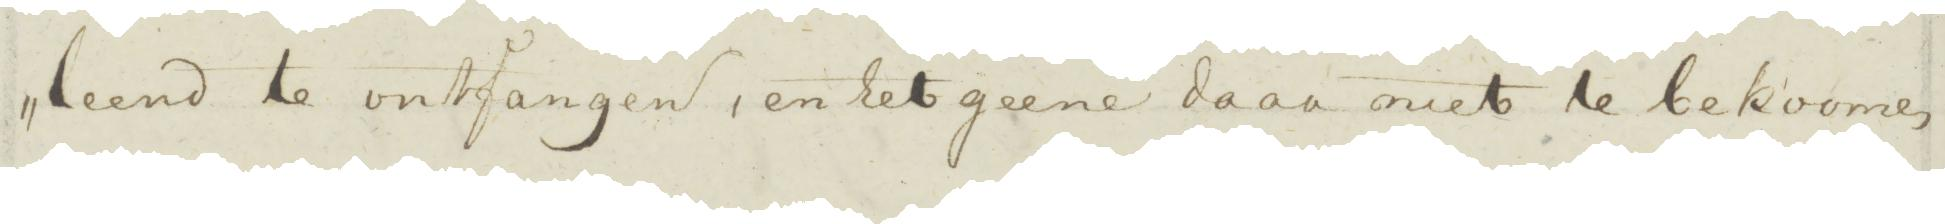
„leend te ontfangen, en het geene daar niet te bekoomen
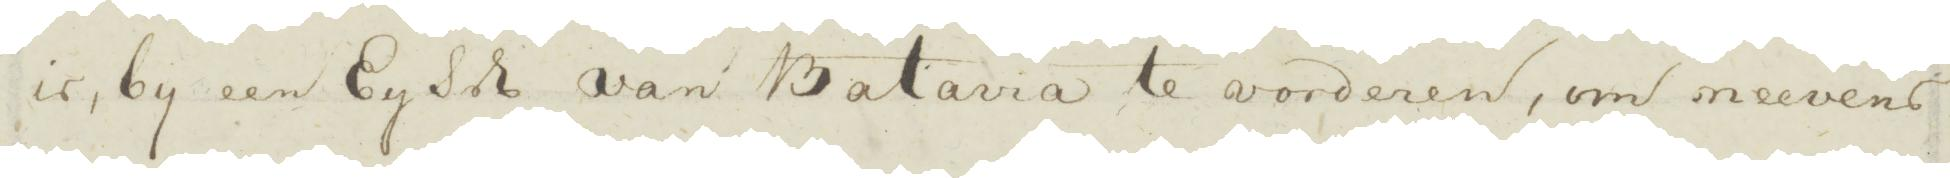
is, bij een Eysch van Batavia te vorderen, om neevens
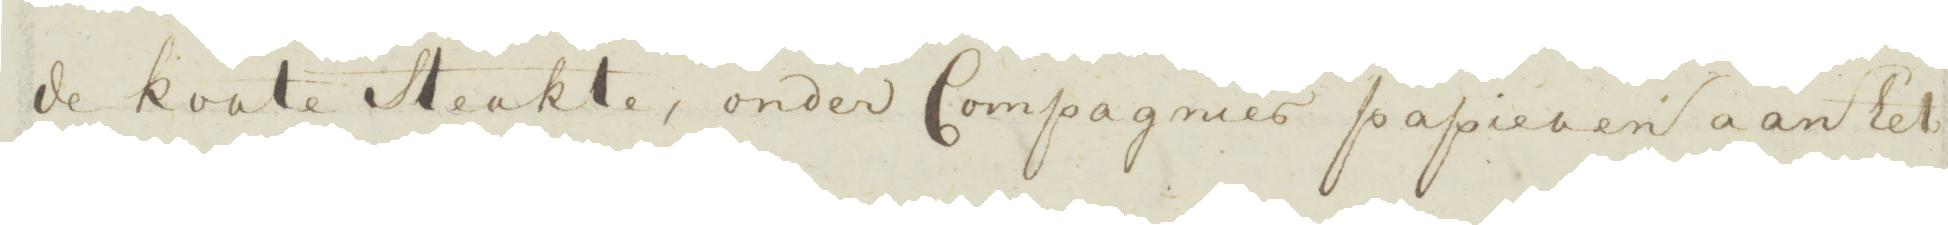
de korte sterkte, onder Compagnies papieren aan het
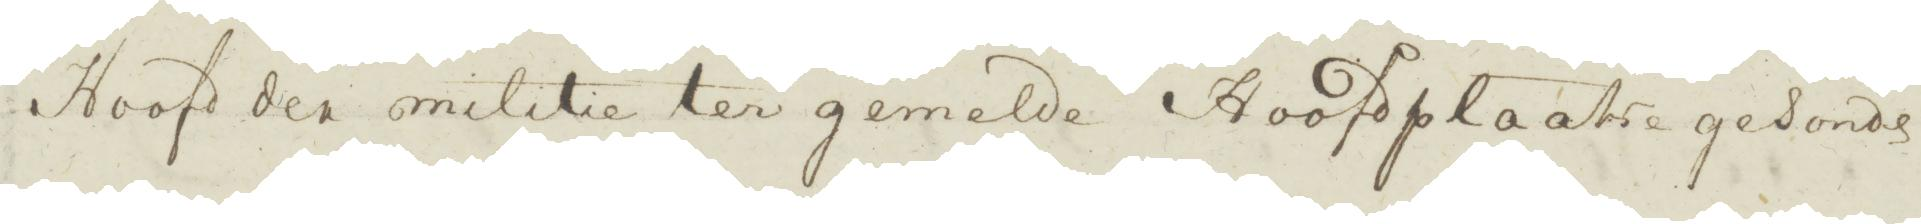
Hoofd der militie ter gemelde Hoofdplaatse gesonden
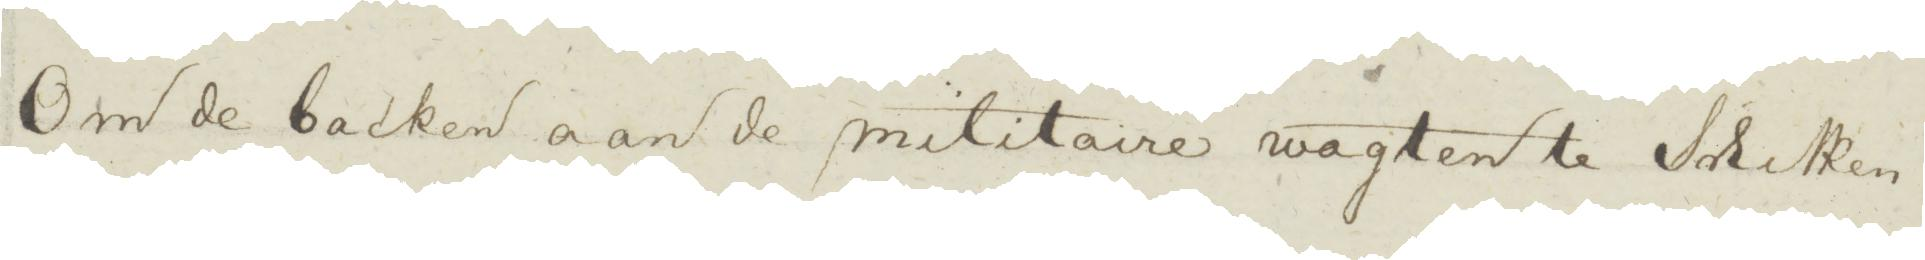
Om de backen aan de militaire wagten te schikken
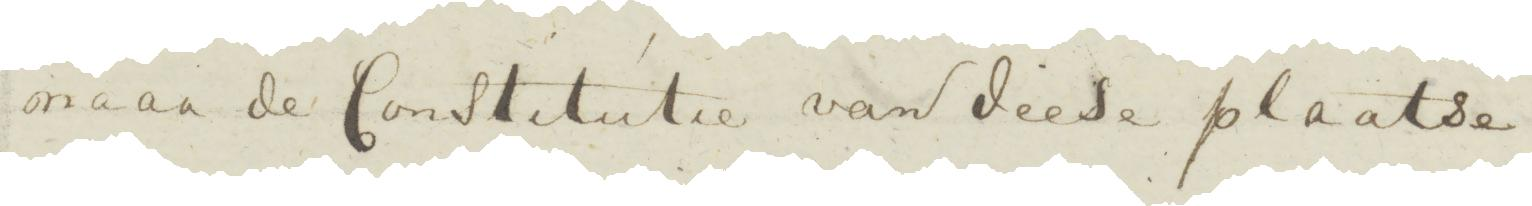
naar de Constitutie van deese plaatse.
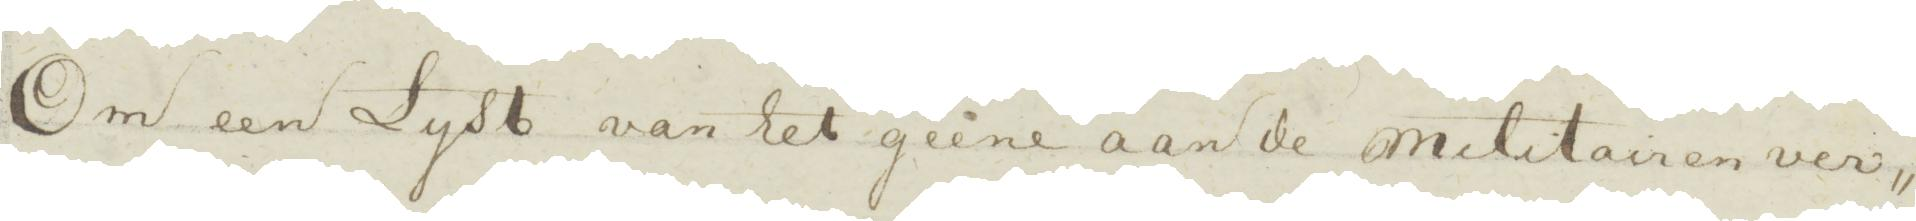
Om een Lyst van het geene aan de militairen ver„
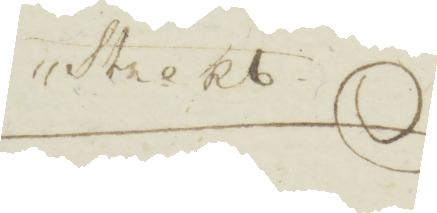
„strekt
